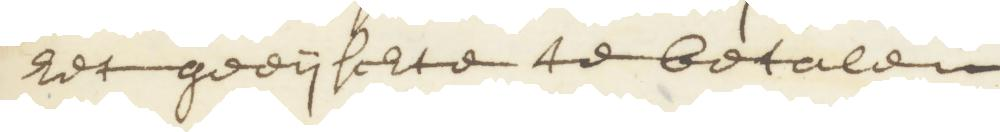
het geeijschte te betalen
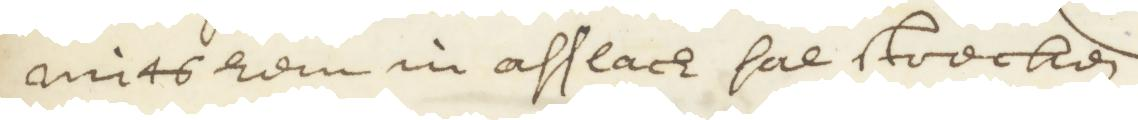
mits hem in afslach sal strecken
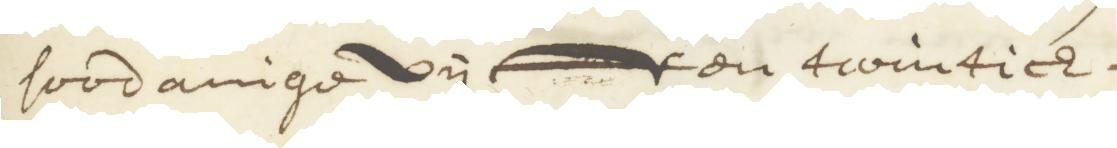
soodanige vijffen twintich.
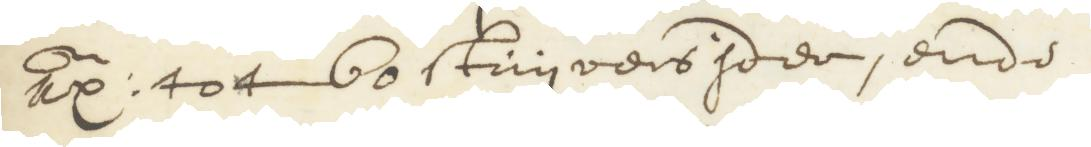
rx: tot 60 stuijvers jder, ende
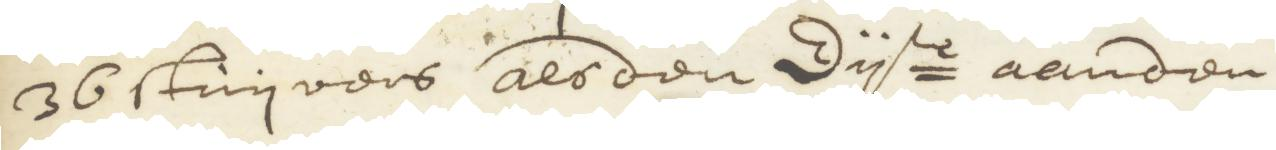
36 stuijvers als den Eij=r aanden
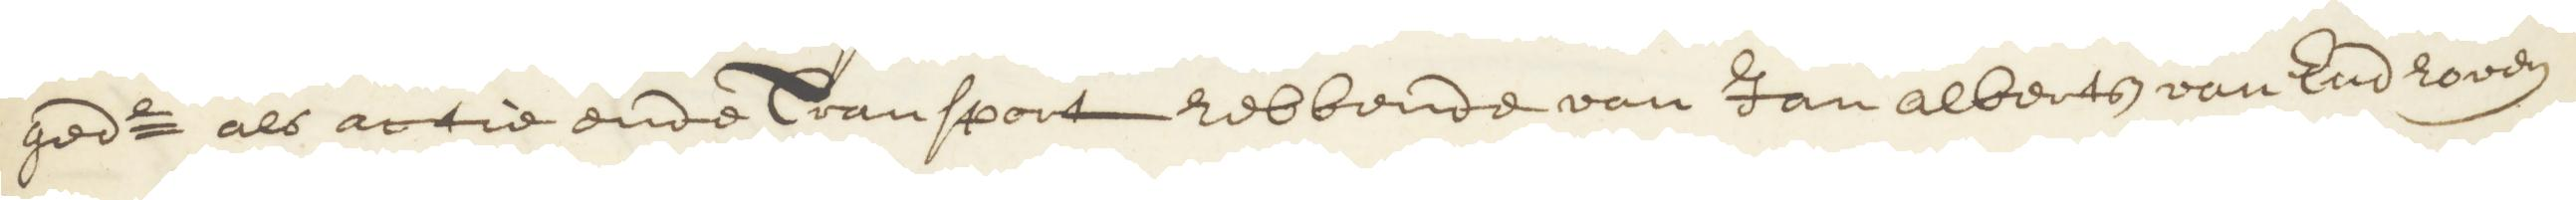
ged=e als actie ende Transport hebbende van Ian alberts van had hoven
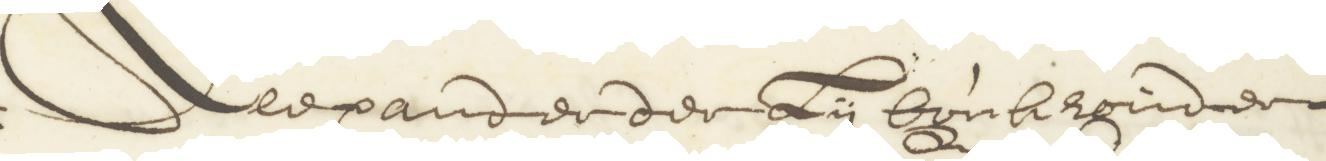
Alexander der Lij boukhouder
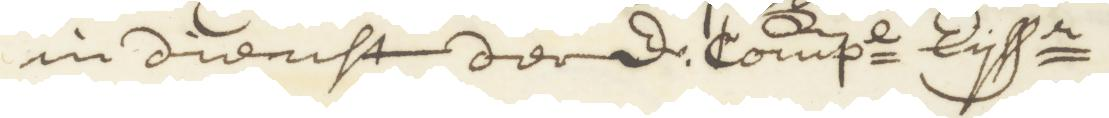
in dienst der E. Comp=e Eijss=r
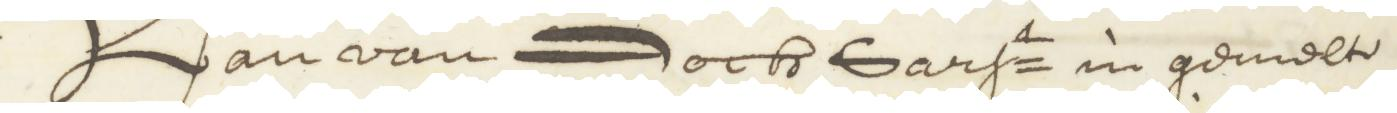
Jan van Goch Sars=t in gemelt
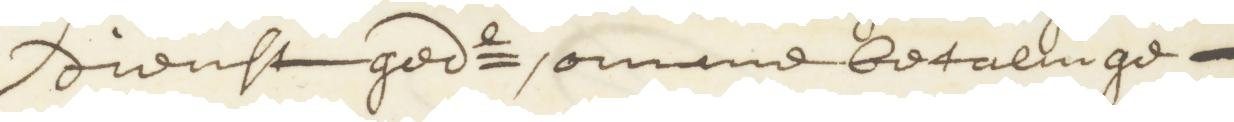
dienst ged=e, omme betalinge —
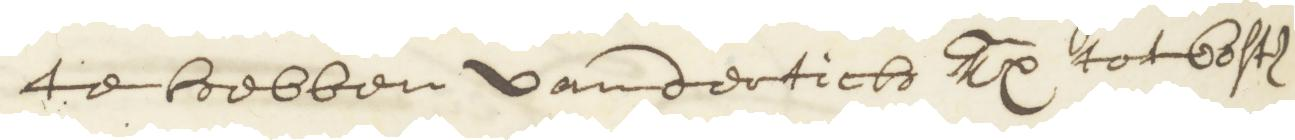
te hebben van dertich rx tot stver
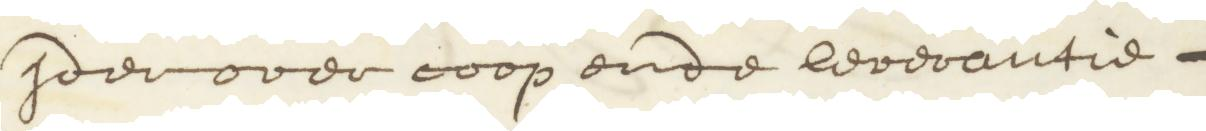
jder over coop ende leverantie
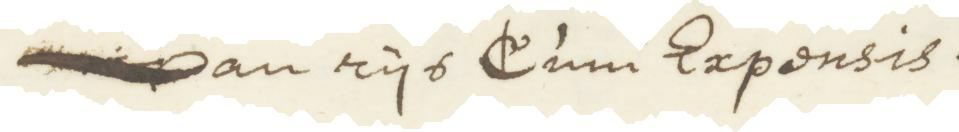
van rijs Cum Expensis
